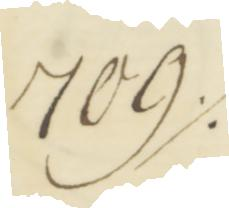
709:
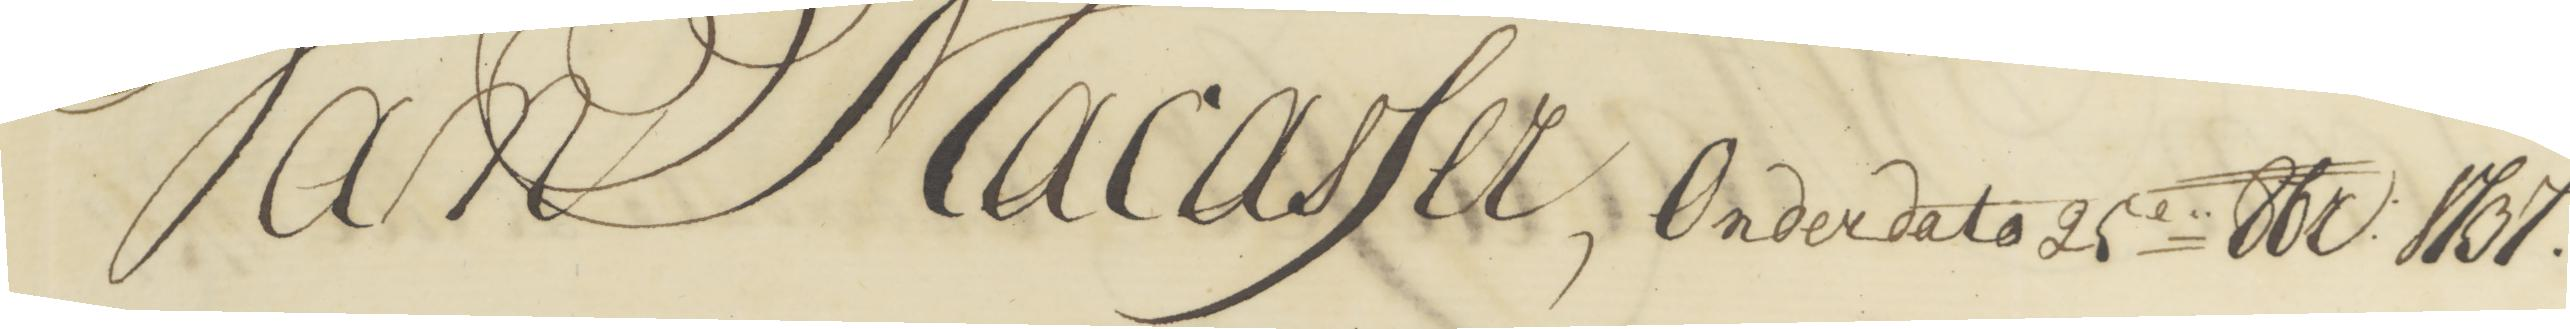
Van Macasser, Onder dato 25=en 8br: 1737.
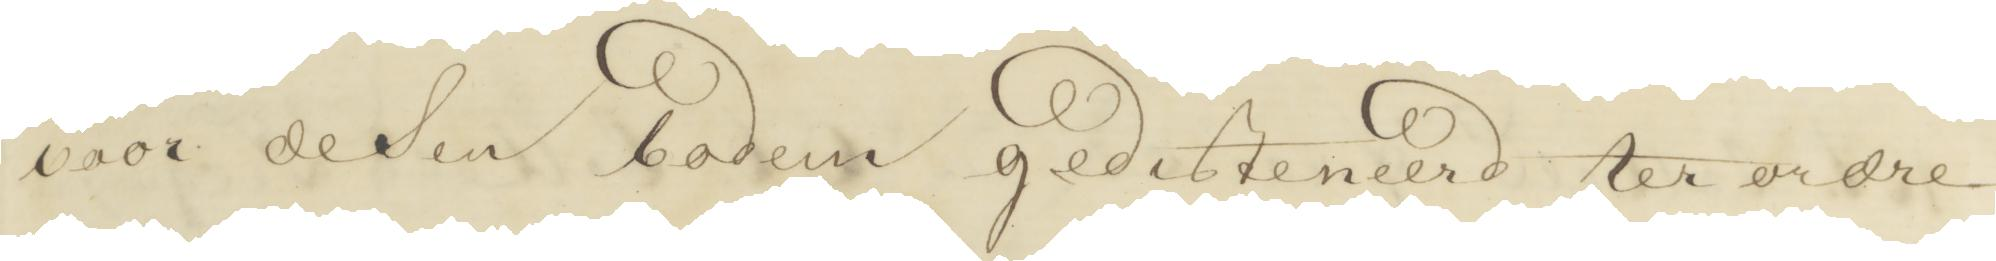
voor desen bodem gedisteneerd ter ordre
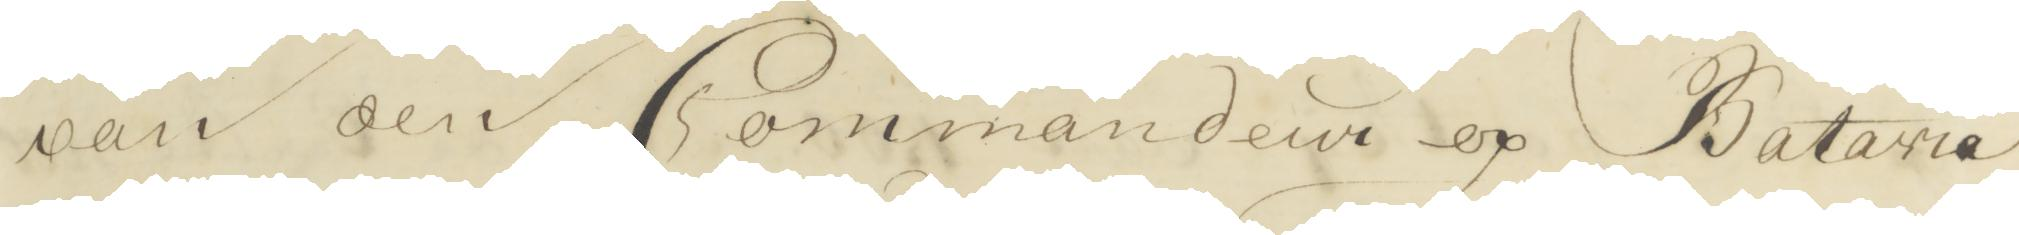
van den Commandeur op Batavia
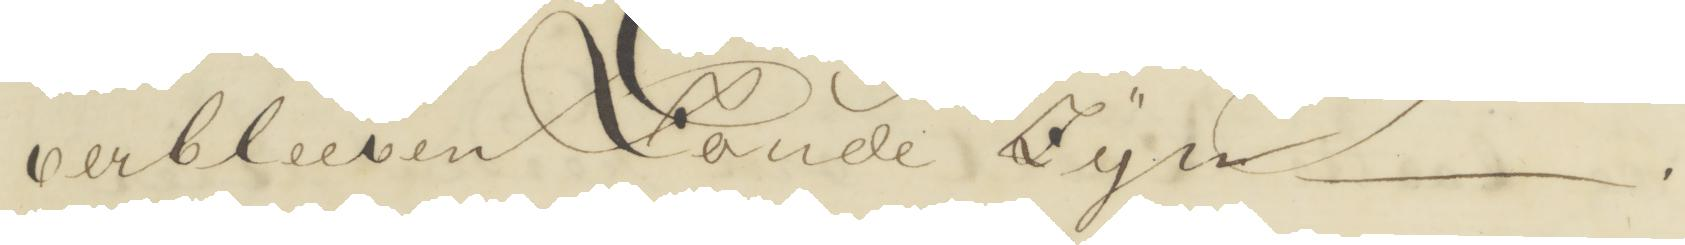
verbleeven zoude zijn _.
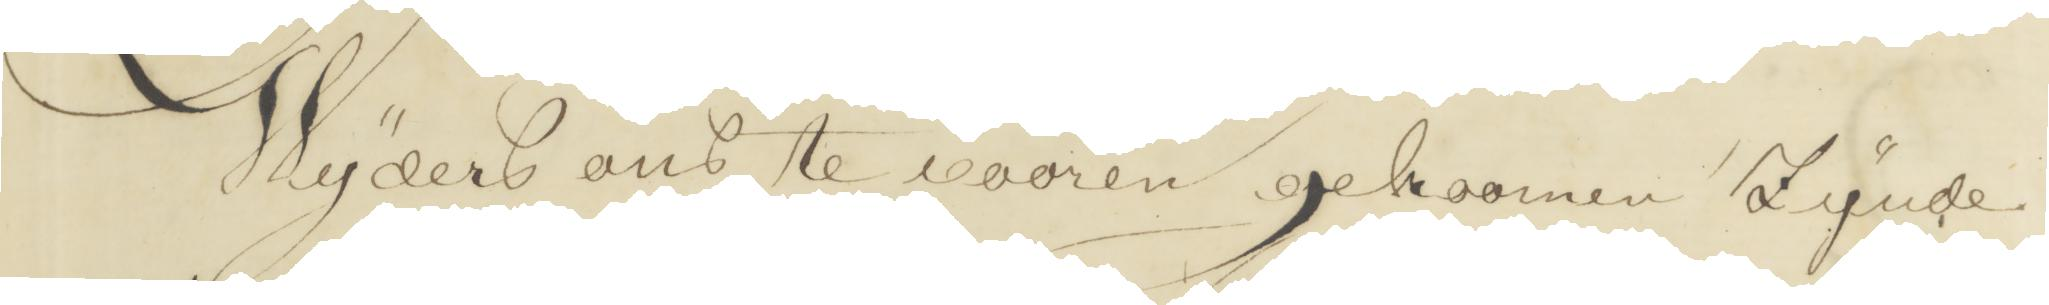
Wijders ons te vooren gekoomen zijnde
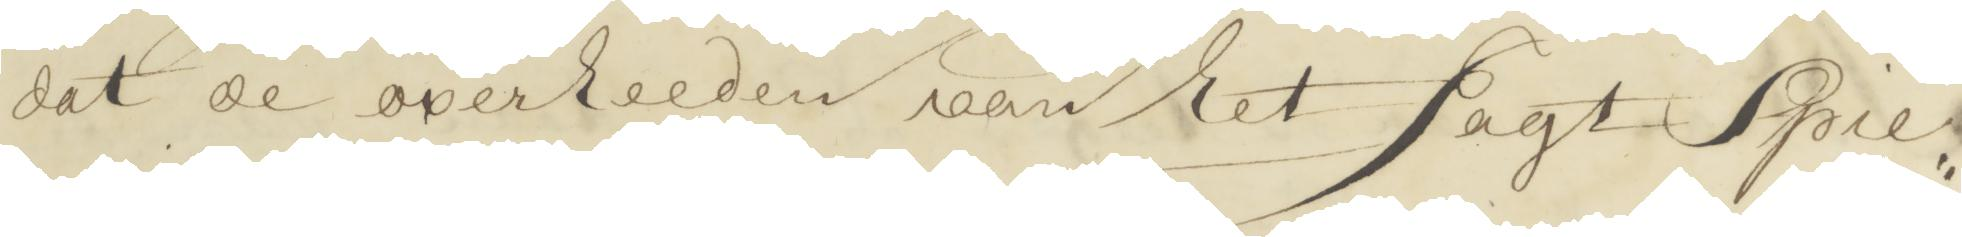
dat de overheeden van het Jagt spie„
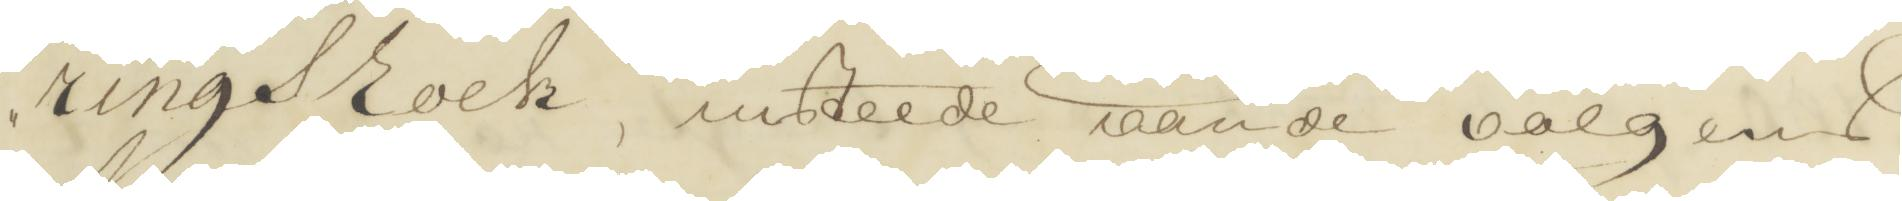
„ringshoek, insteede van de volgens
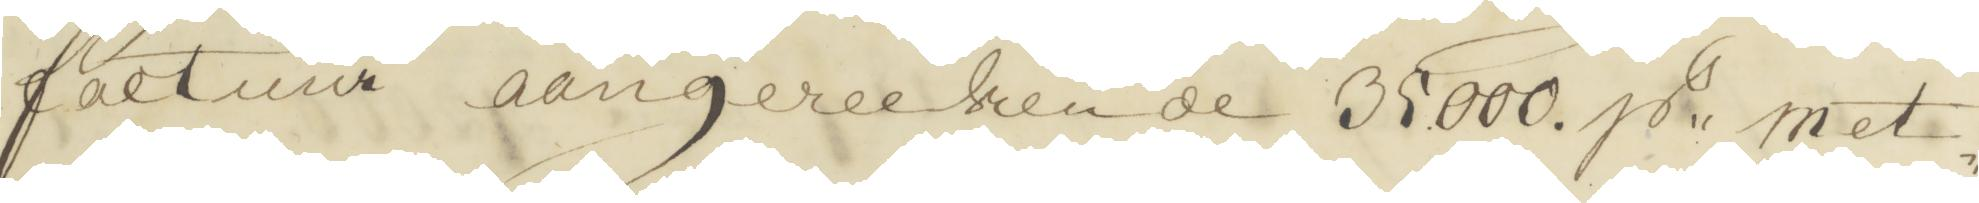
factuur aangereeken de 35000. p„s met„
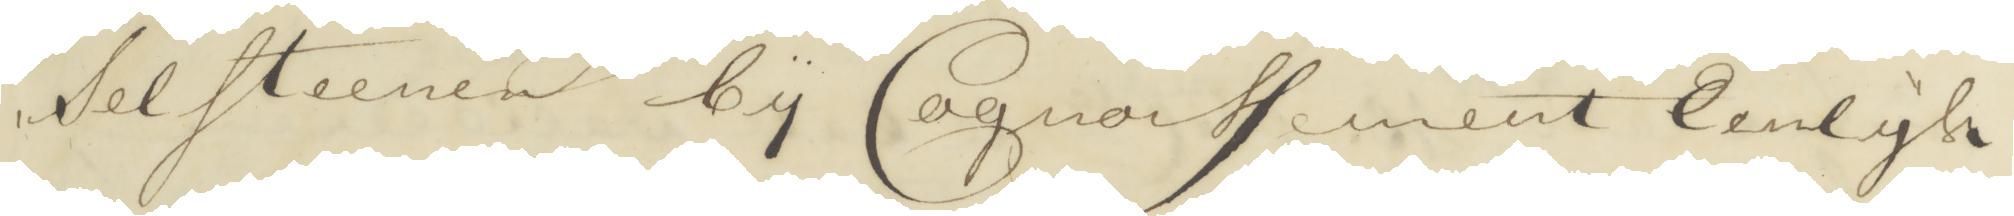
„selsteenen bij Cognoissement Eenlijk
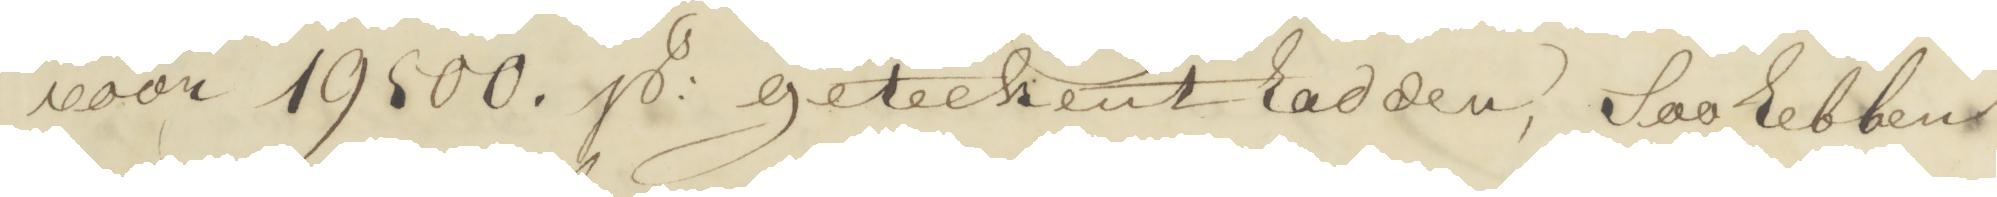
voor 19500. p:s geteekent hadden, soo hebben
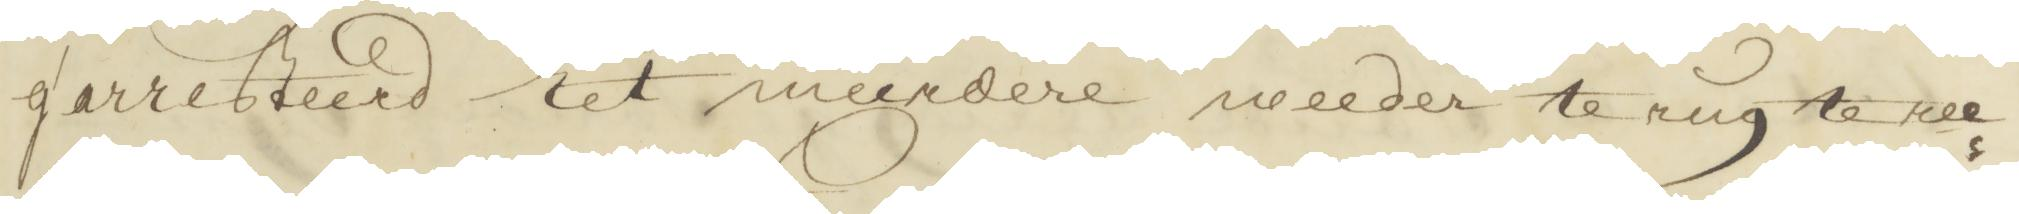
g'arresteerd het meerdere weeder te rug te ree„
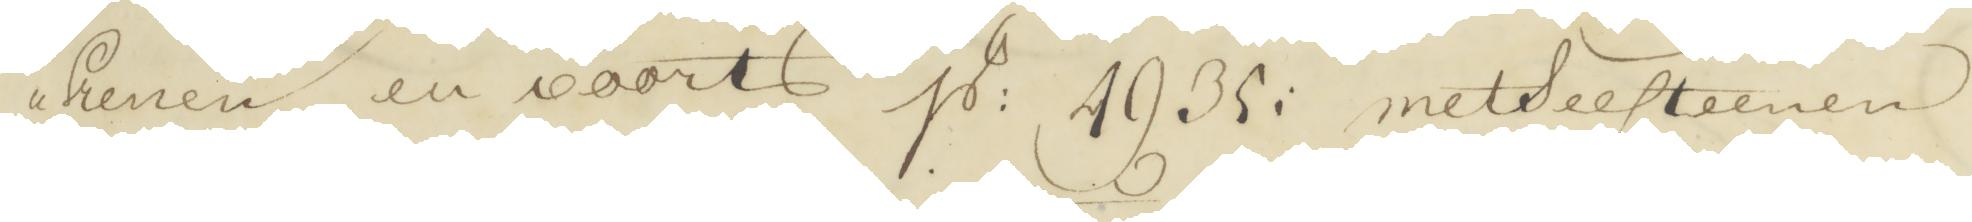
„kenen en voorts p:s 4935: metselsteenen
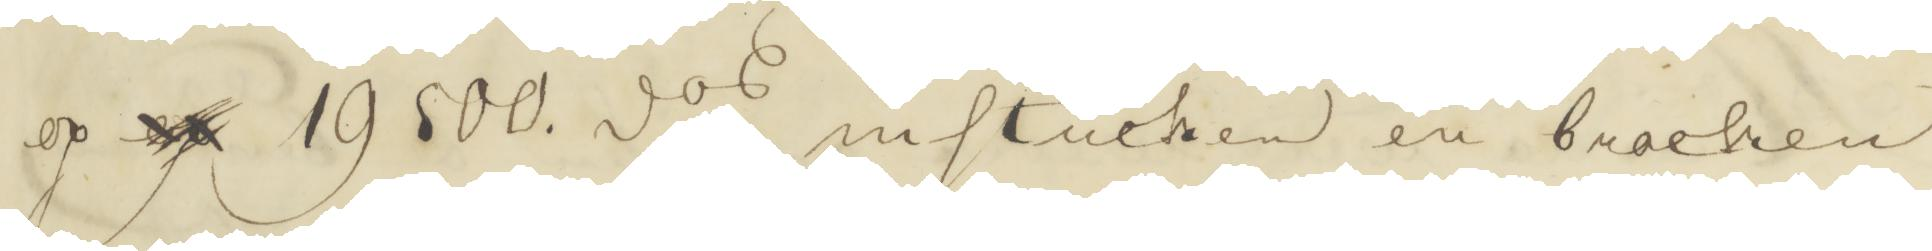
op op 19500. d=os in stucken en brocken
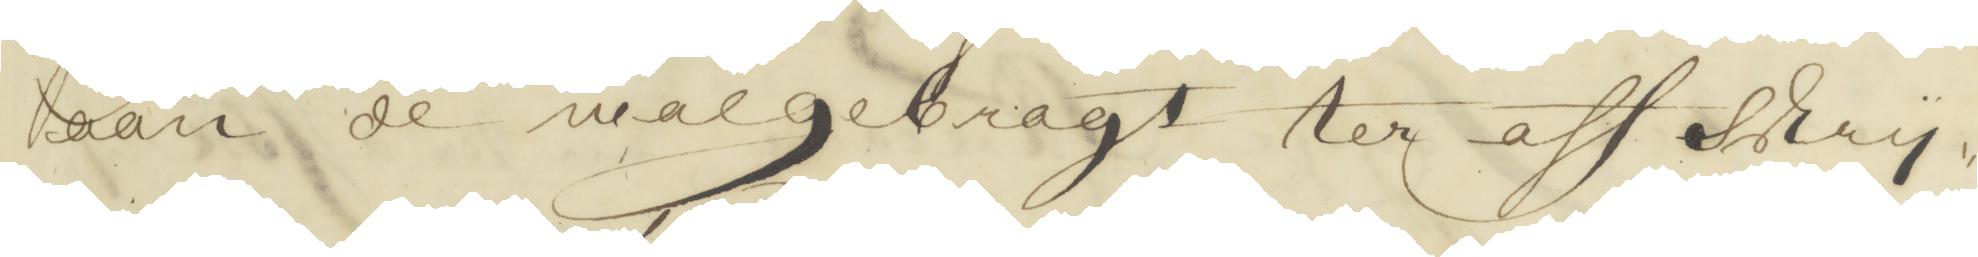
aan de wal gebragt ter aff schrij„
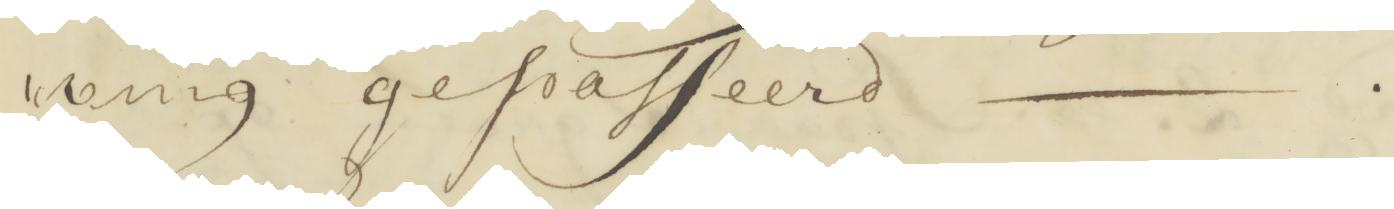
„ving gepasseerd —.
